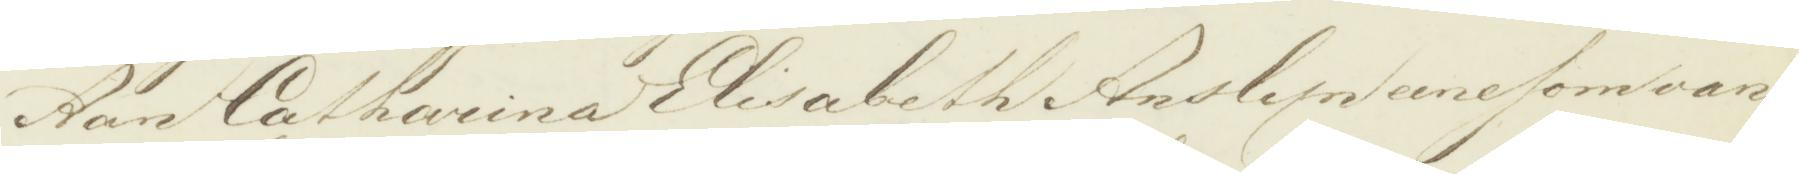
Aan Catharina Elisabeth Anslyn eene Som van
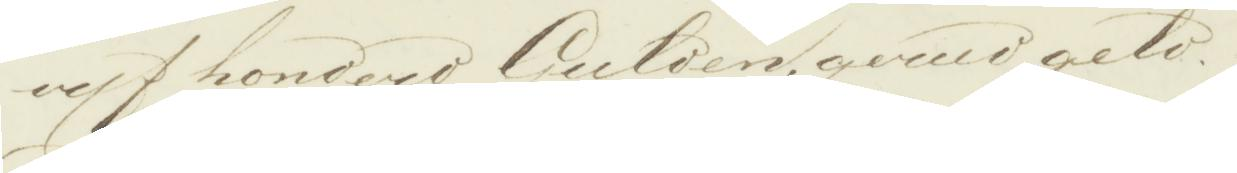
vyf honderd Gulden gereed geld.
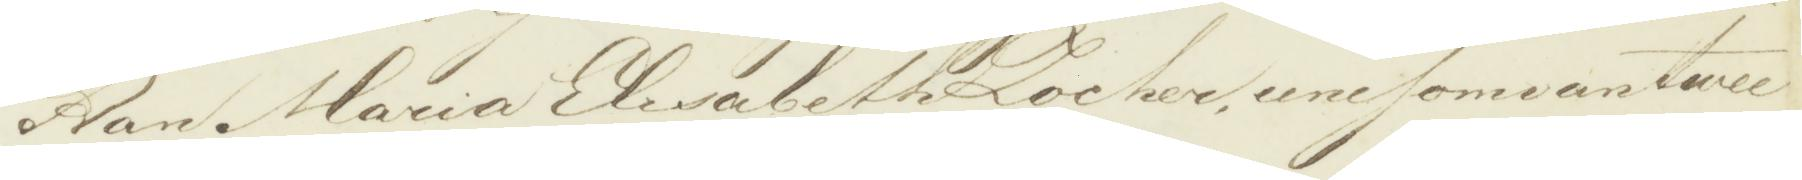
Aan Maria Elisabeth Zocher, eene Som van twee
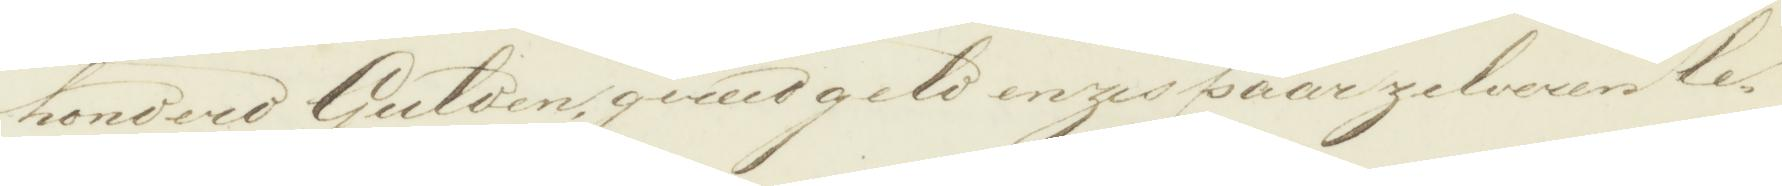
honderd Gulden, gereed geld en zes paar zilveren le„
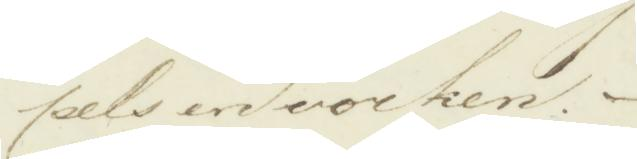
pels en vorken.-
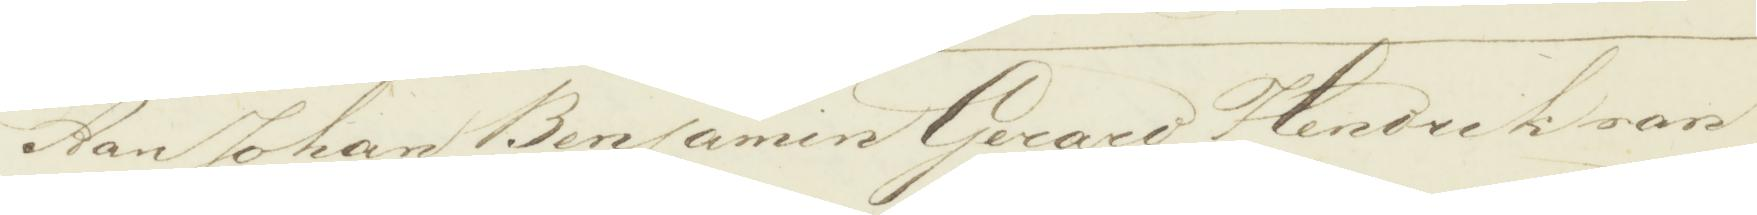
Aan Johan Benjamin Gerard Hendrik van
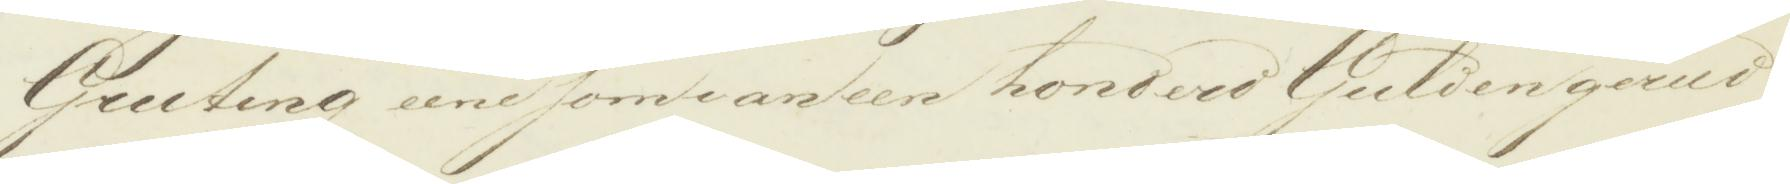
Gruting eene Som van een honderd Gulden gereed
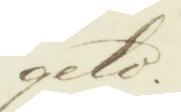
geld.
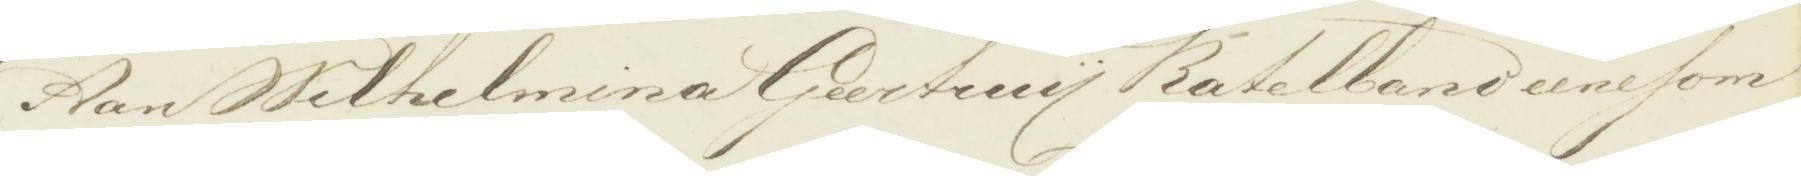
Aan Wilhelmina Geertruij Ratelband eene Som
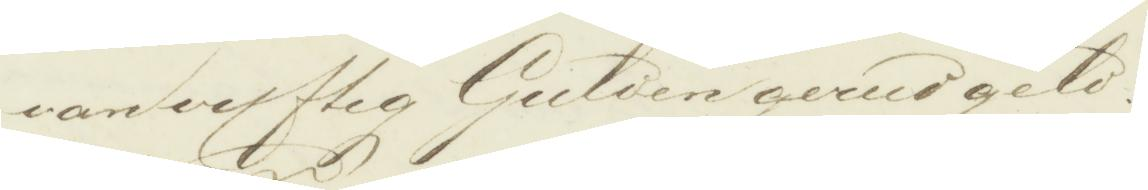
van vyftig Gulden gereed geld.
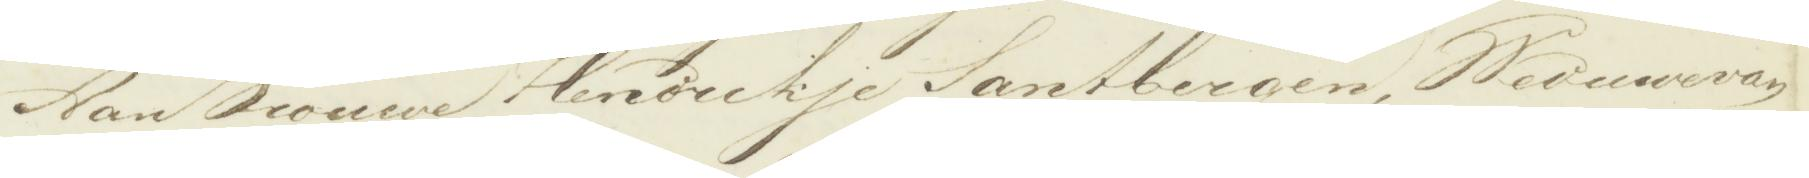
Aan Vrouwe Hendrikje Santbergen, Weduwe van
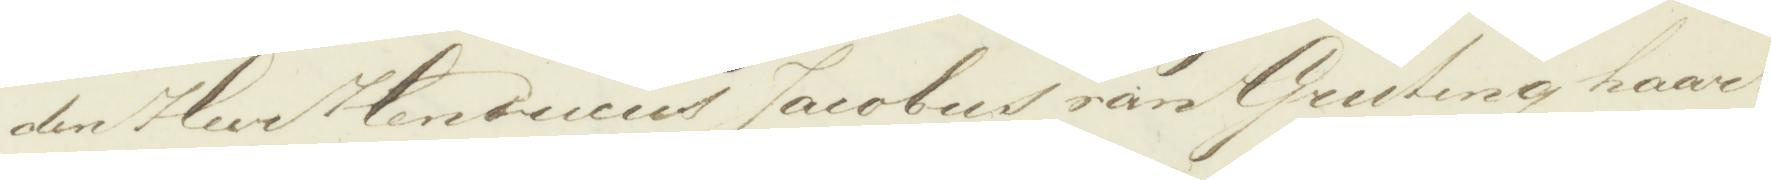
den Heer Hendricus Jacobus van Gruting haar
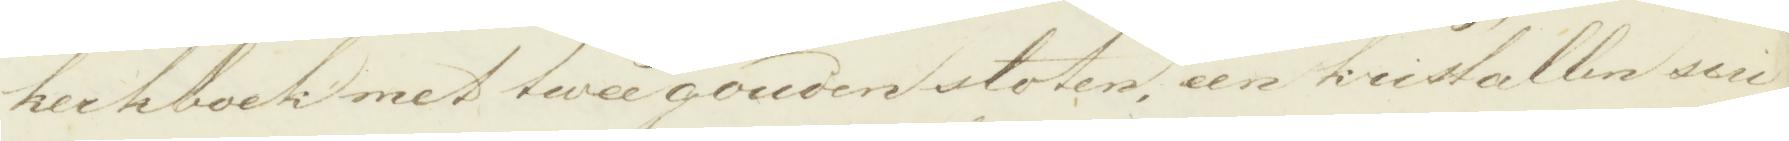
kerkboek met twee gouden sloten, een kristallen sui
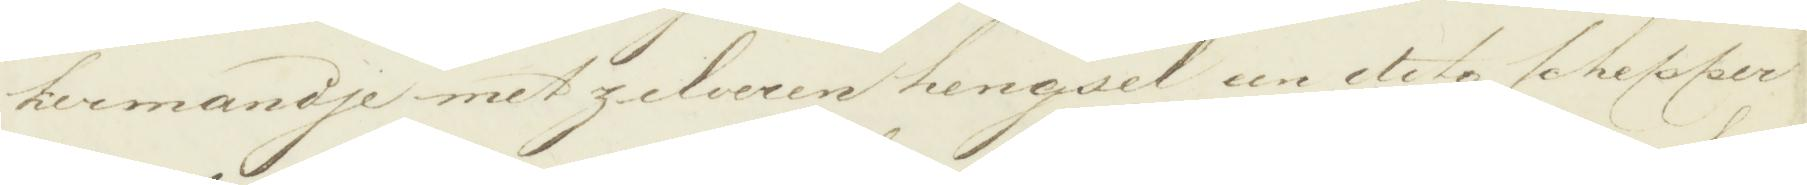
kermandje met zilveren hengsel een dito schepper
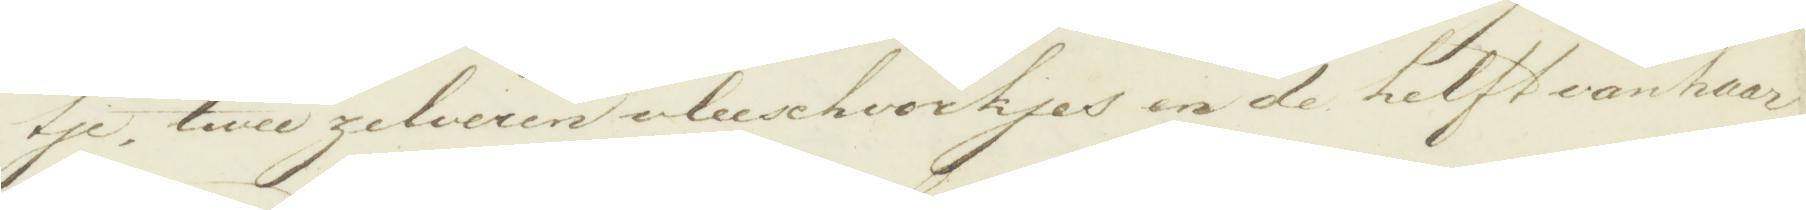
tje, twee zilveren vleeschvorkjes en de helft van haar
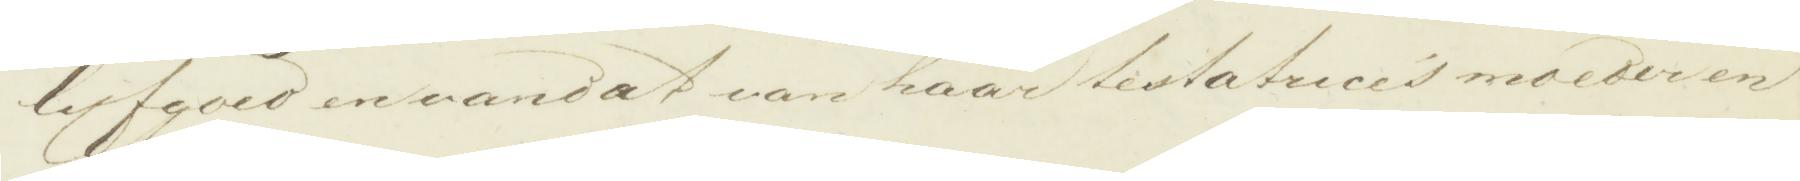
lyfgoed en van dat van haar testatrices moeder en
